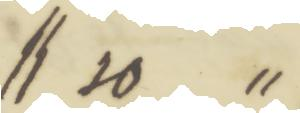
„ 10 „
